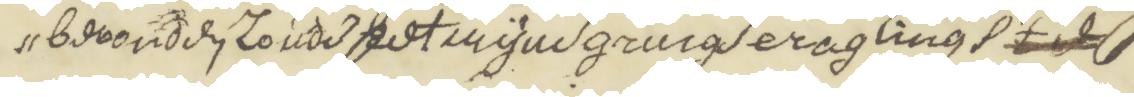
„bevonden zoude het mijne gringe eragtings 't e
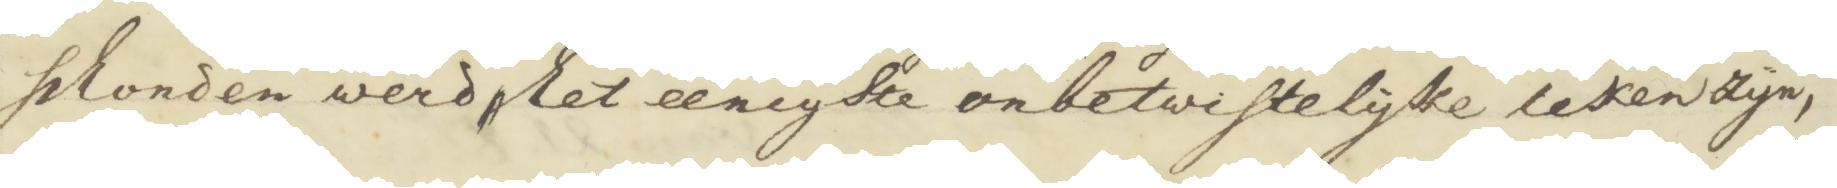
schonden werd „ het eenigste onbetwistelijke teken zijn,
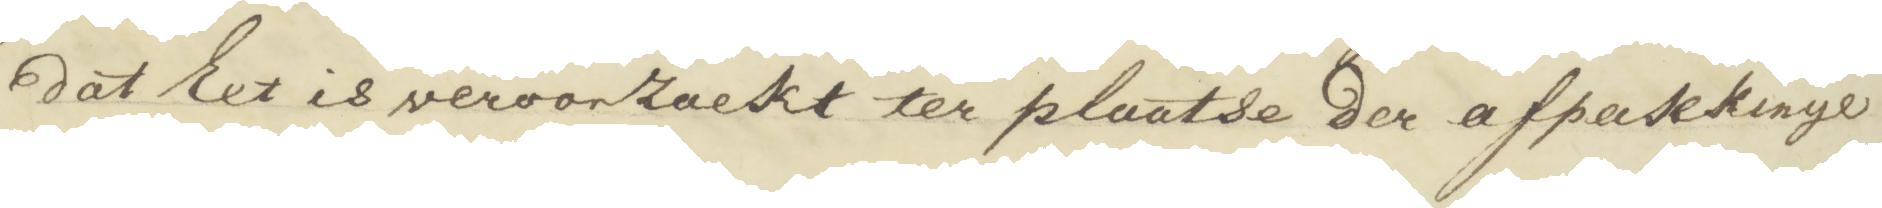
dat het is veroorzaekt ter plaatse der afpakkinge
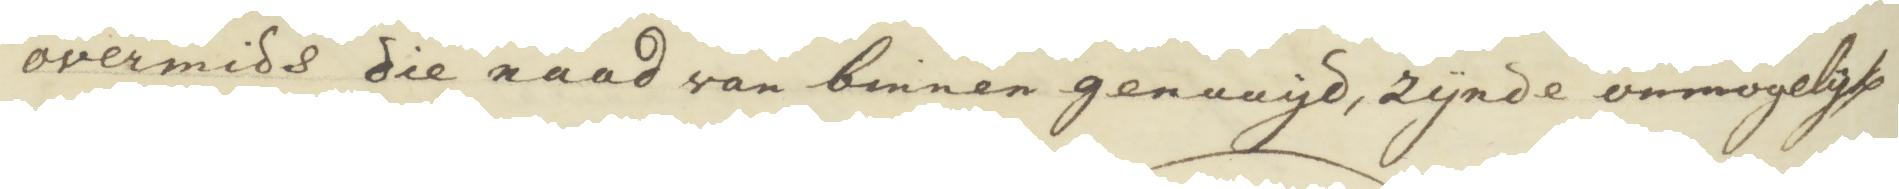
overmids die naad van binnen genaaijd, zijnde onmogelijk
